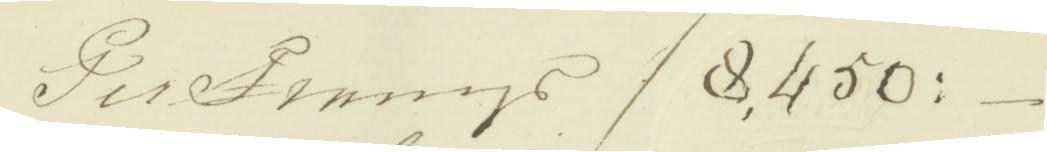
Per Transp ƒ 8,450: —
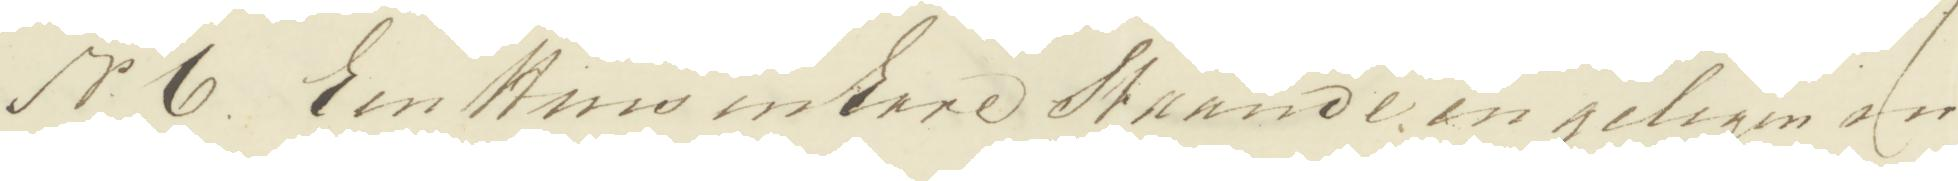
N. 6. Een Huis en Erve staande en gelegen in
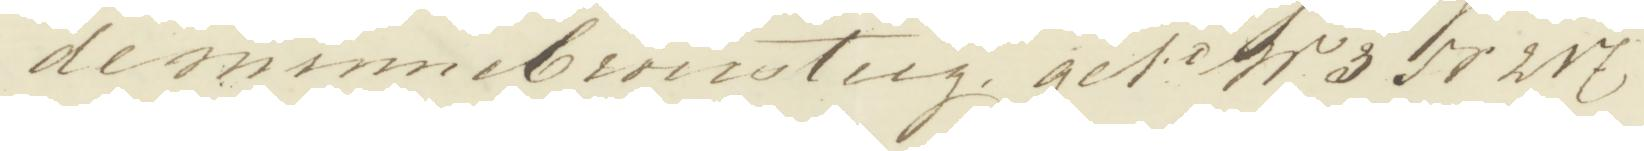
de minnebroersteeg, get:d W 3 N 217.
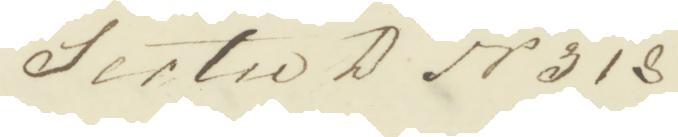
Sectie D N 318
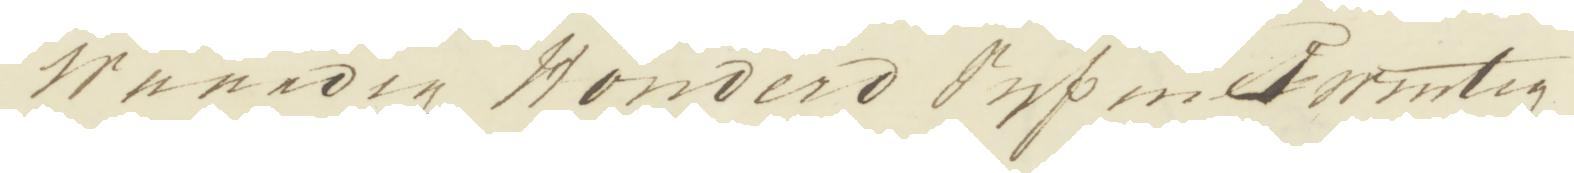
Waardig Honderd Vyfentwintig
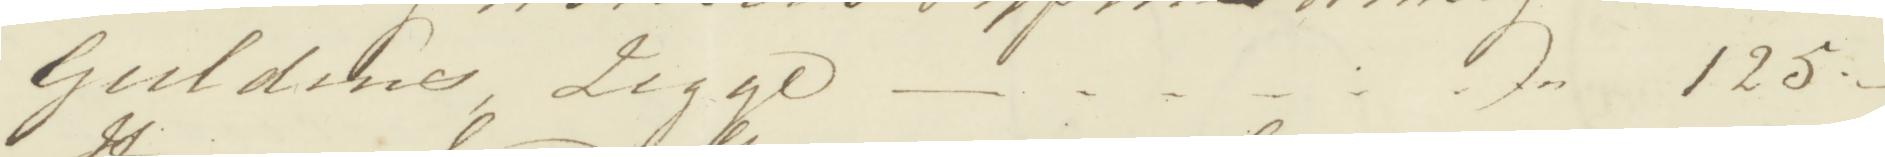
Guldens Zegge — - - - - - ƒ125:
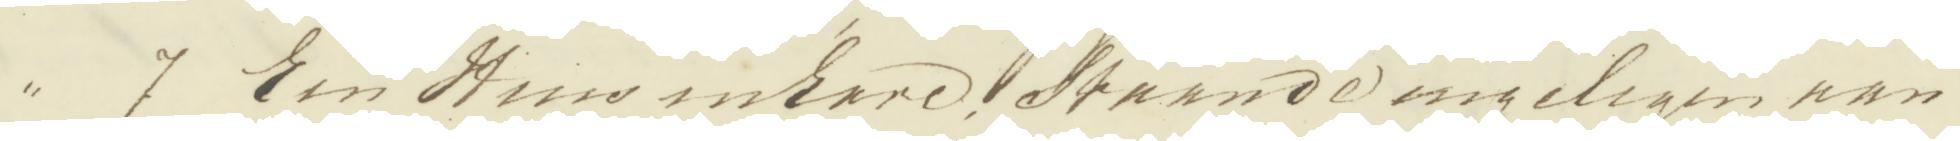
„ 7 Een Huis en Erve staande en gelegen aan
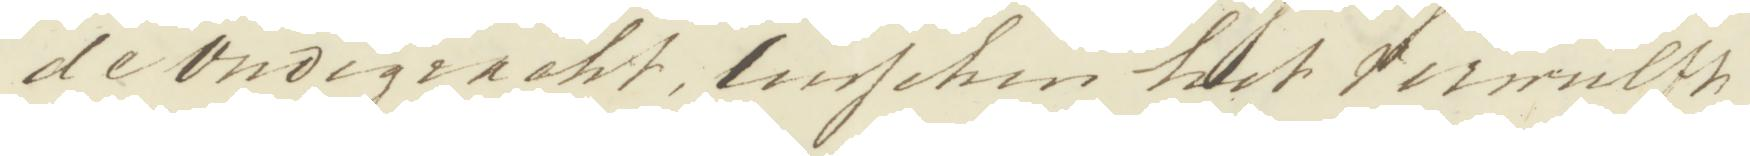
de Oudegracht, tusschen het Verwulft
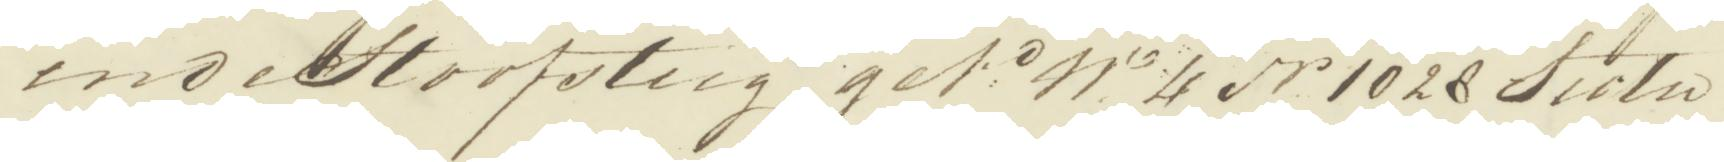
en de Hoofsteeg get:d W. 4 N. 1028 Sectie
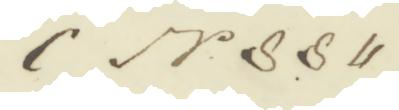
C N. 884
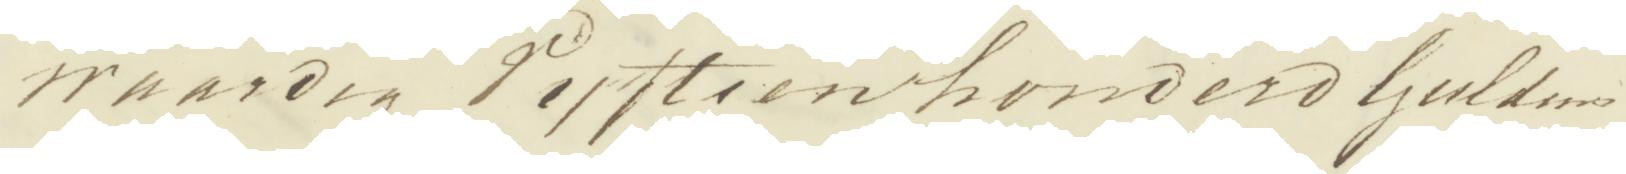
waardig Vyftien honderd Guldens
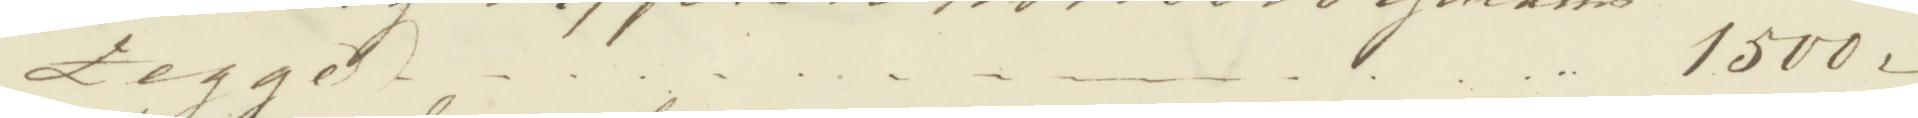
Zegge - - . . . . . . - - - - - . . . .. 1500 -
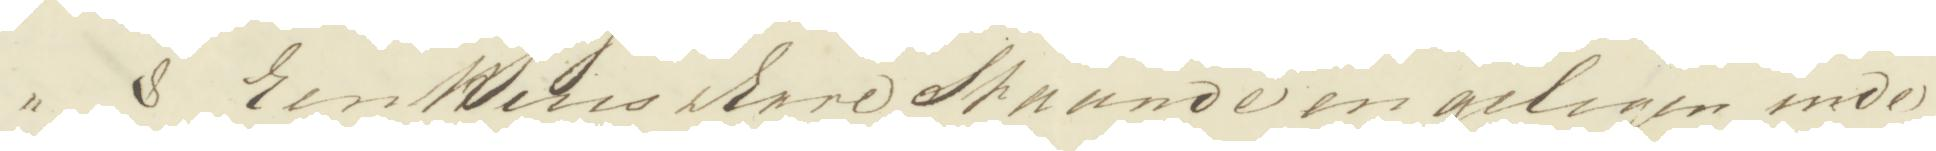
„ 8 Een Huis en Erve staande en gelegen inde
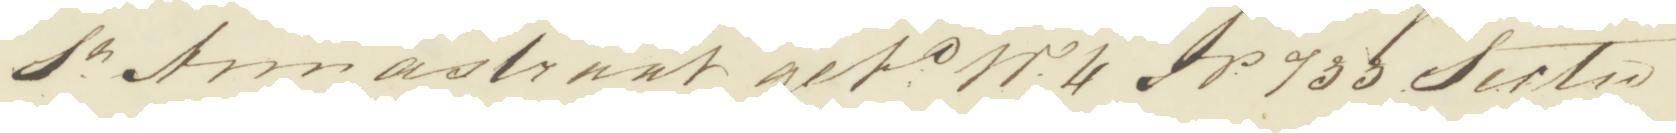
S.t Annastraat get:d W. 4 N. 733 Sectie
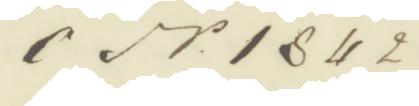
C N. 1842
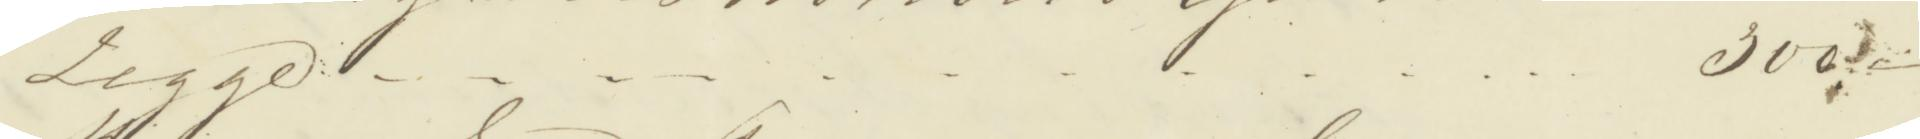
Zegge - - - - - - - - . . . . 300,-
